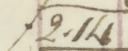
ƒ 2.14
